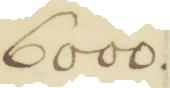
6000.
